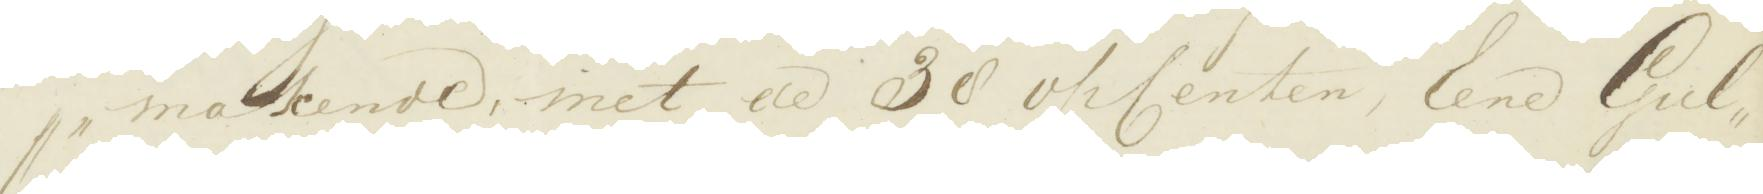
„ „makende, met de 38 opCenten, Eene Gul„
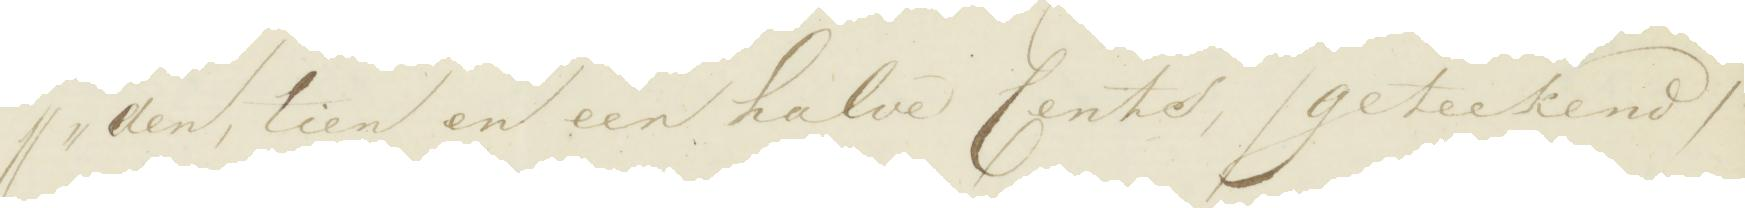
„ „den, tien en een halve Cents, /geteekend /
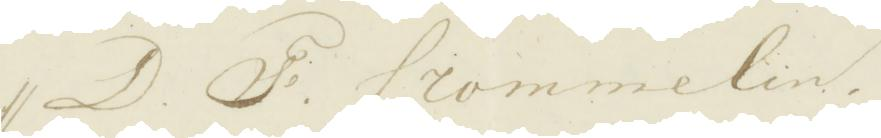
„ D. F. Crommelin. -
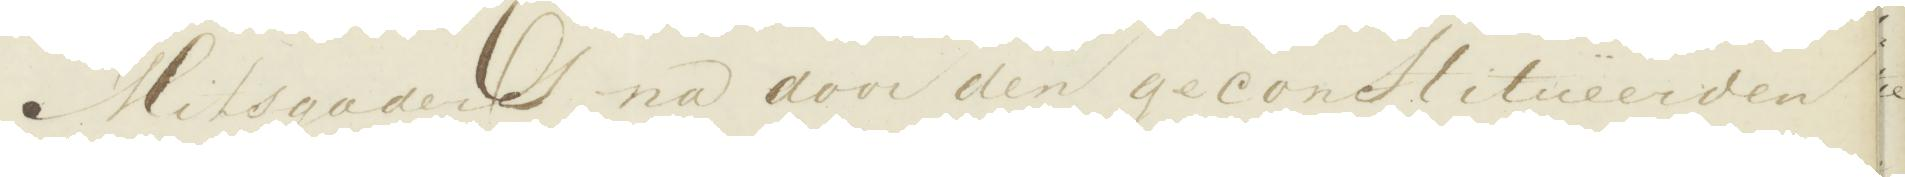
Mitsgaders na door den geconstitueerden
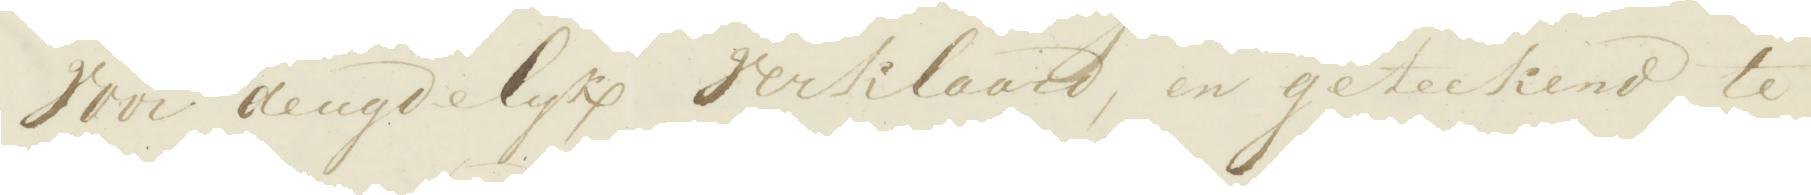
Voor deugdelyk verklaard, en geteekend te
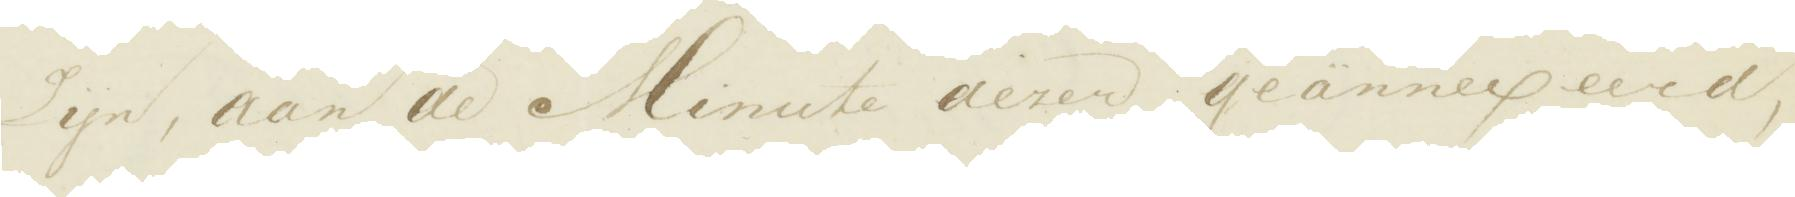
zijn, aan de Minute dezer geannexeerd,
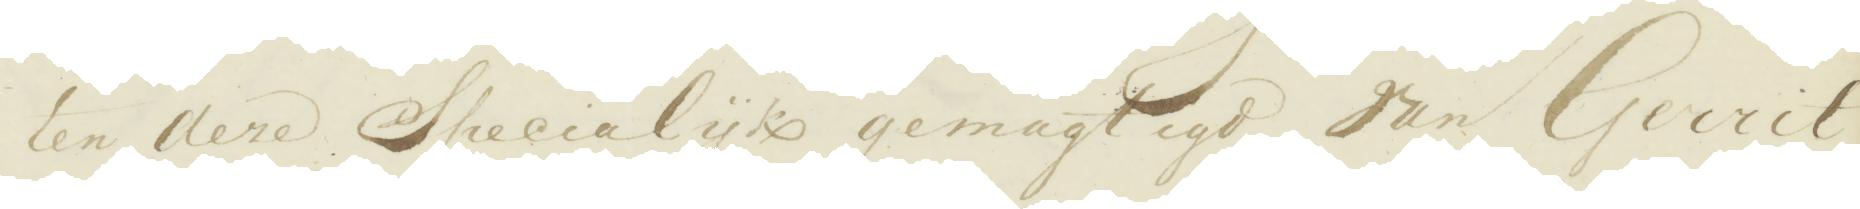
ten deze Specialijk gemagtigd van Gerrit
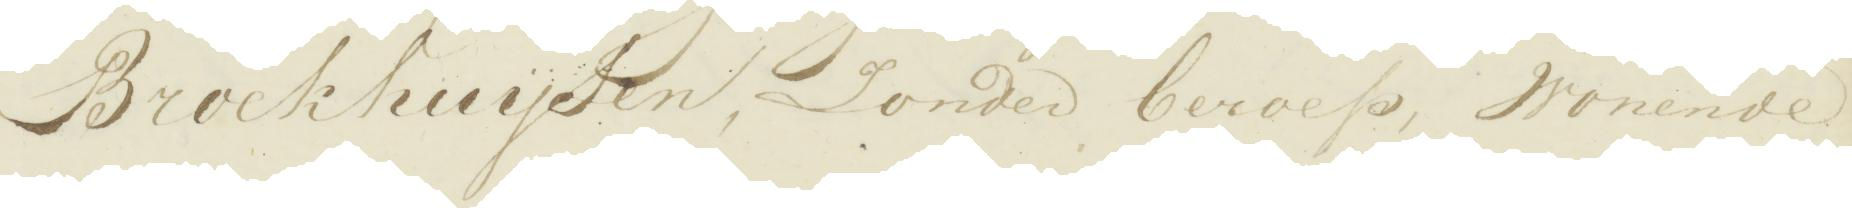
Broekhuijsen, zonder beroep, wonende
